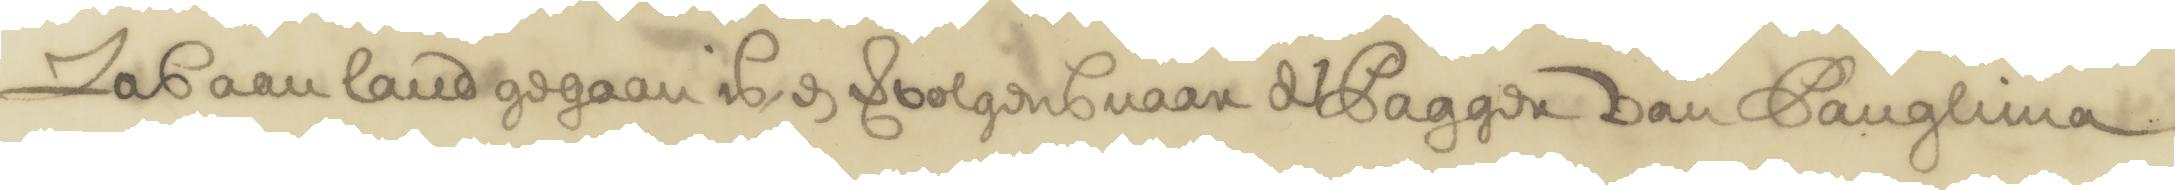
zas aan land gegaan is, en vervolgens naar de Pagger van Panglima
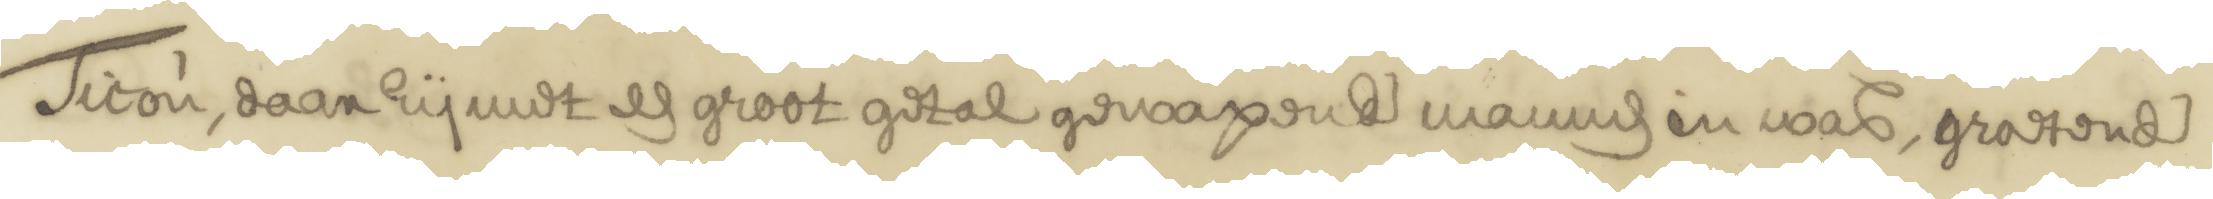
Ticou, daar hij met een groot getal gewapende mannen in was, groetende
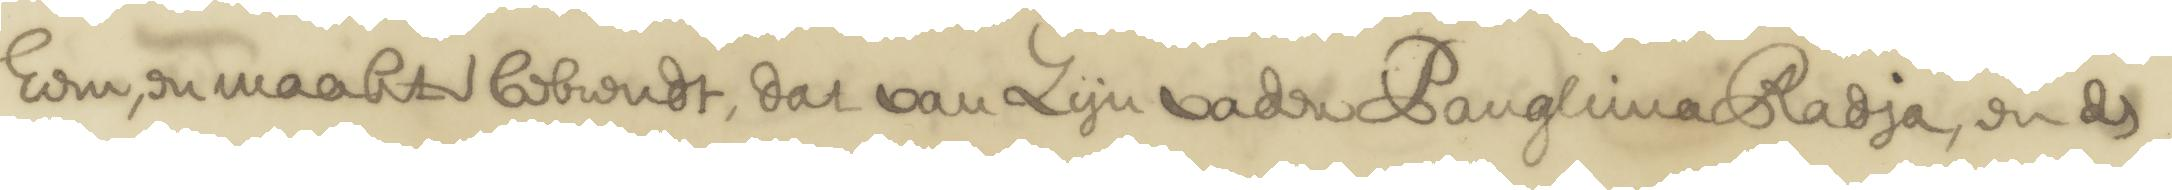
hem, en maakte bekendt, dat van zijn vader Panglima Radja, en den
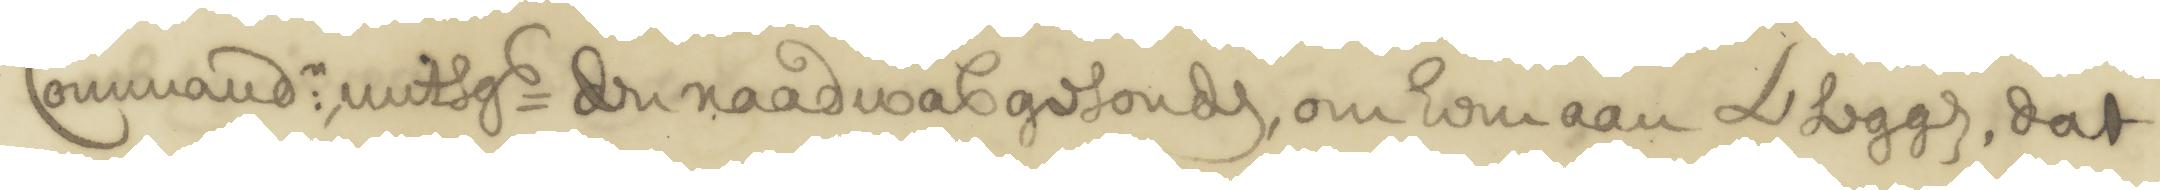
Command:r mitsg=s den raad was gesonden, om hem aan te seggen, dat
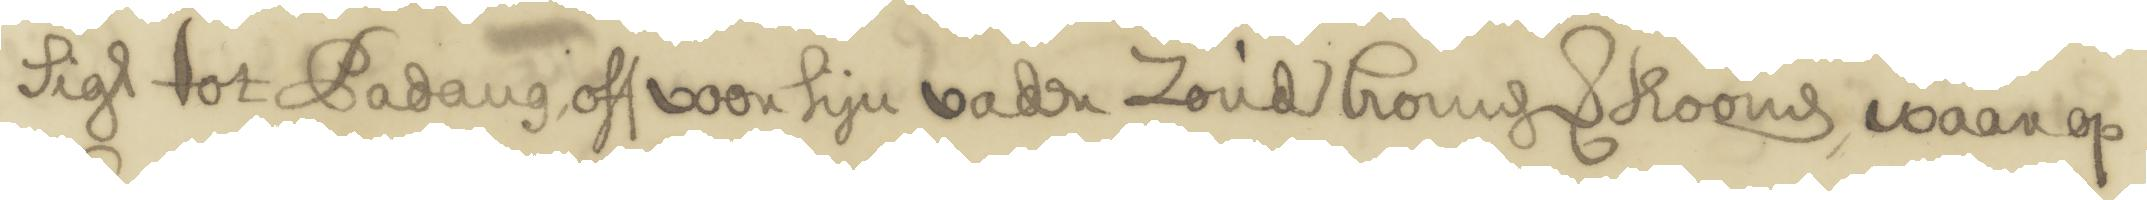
sigh tot Padang off voor sijn vader zoude komen verthoonen, waar op
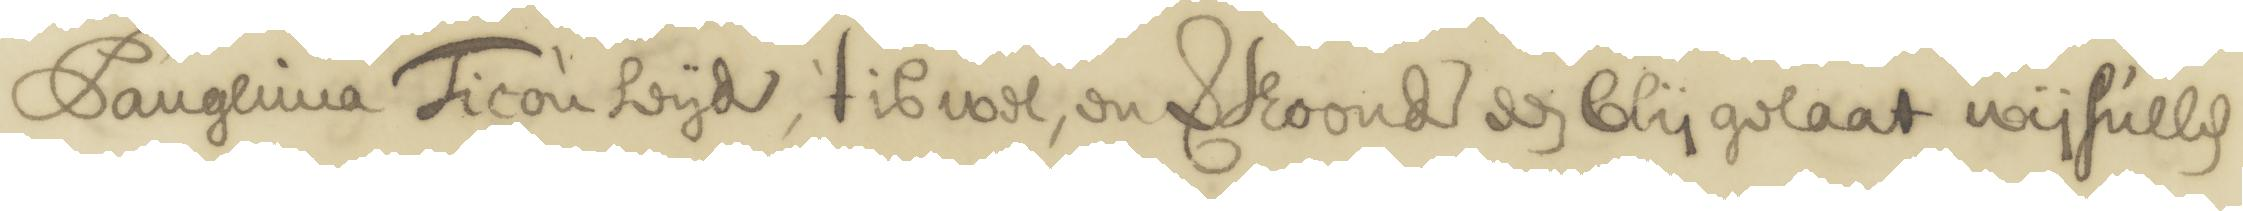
Panglima Ticou seijde, ’t is wel, en verthoonde een blij gelaat wij sullen
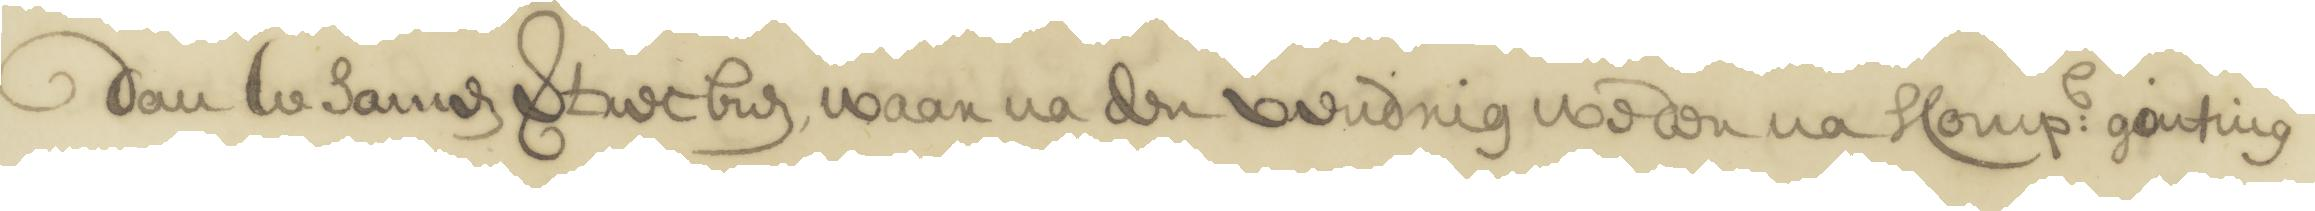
dan te samen vertrecken, waar na den vendrig weder na sComp:s gonting
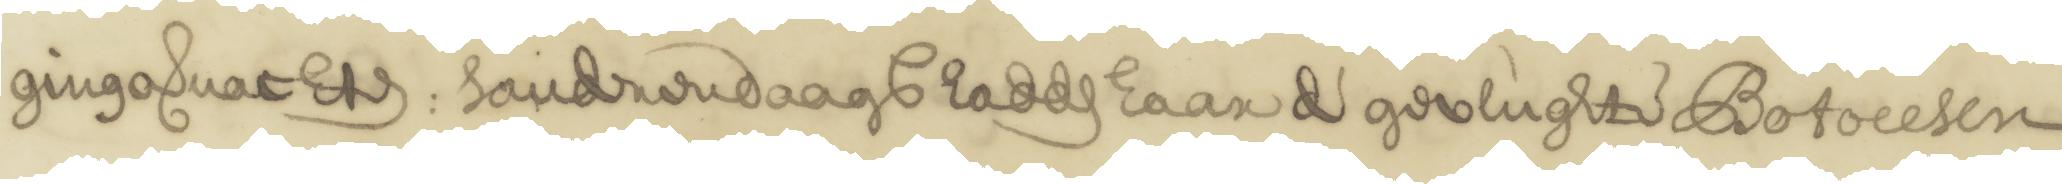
ging overnachten: sanderendaags hadden haar de gevlughte Botoeesen
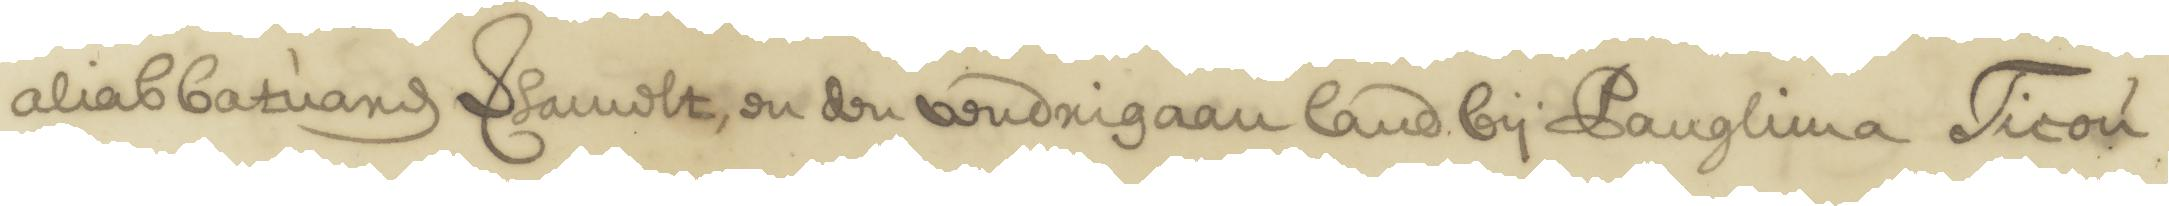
alias batuaren versamelt, en den vendrig aan land bij Panglima Ticou
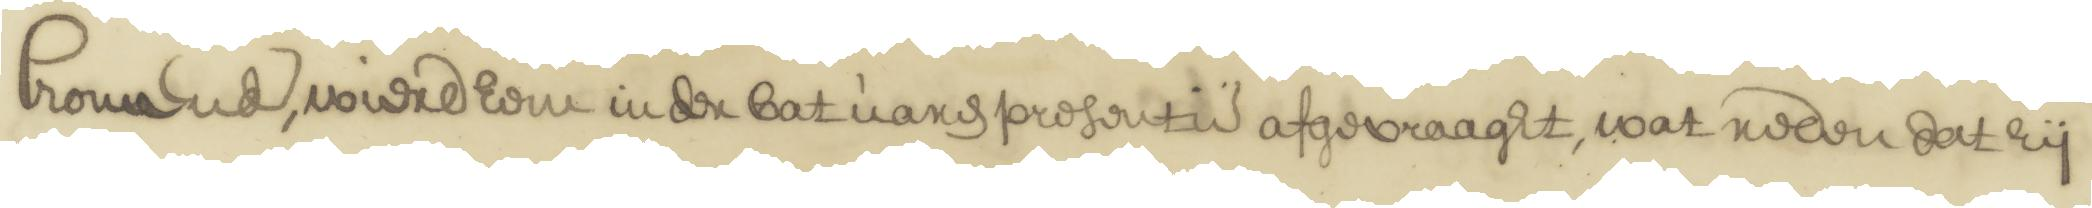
komende, wierd hem in der batuaren presentie afgevraaght, wat reden dat hij
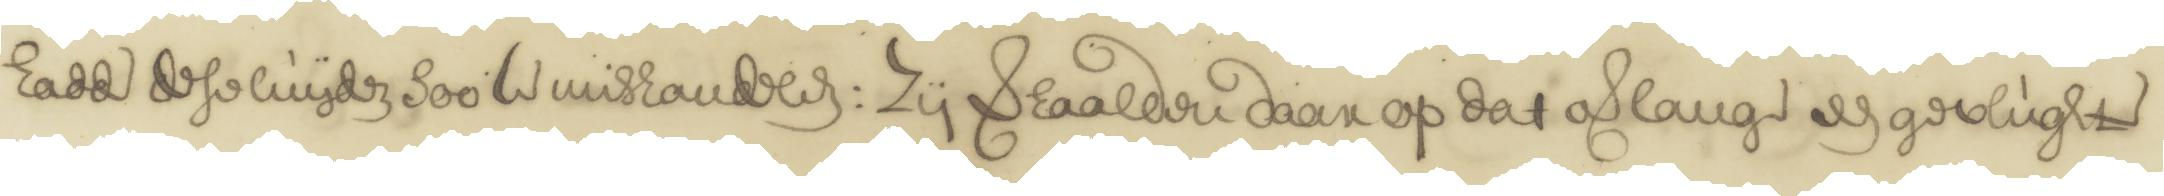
hadde dese luijden soo te mishandelen: zij verhaalden daar op dat overlange een gevlughte
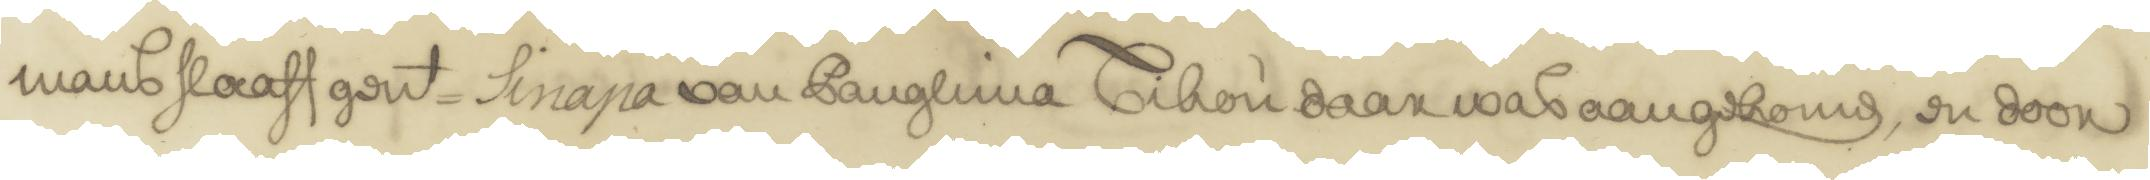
mans slaaff gen=t Sinapa van Panglima Tikou daar was aangekomen, en door
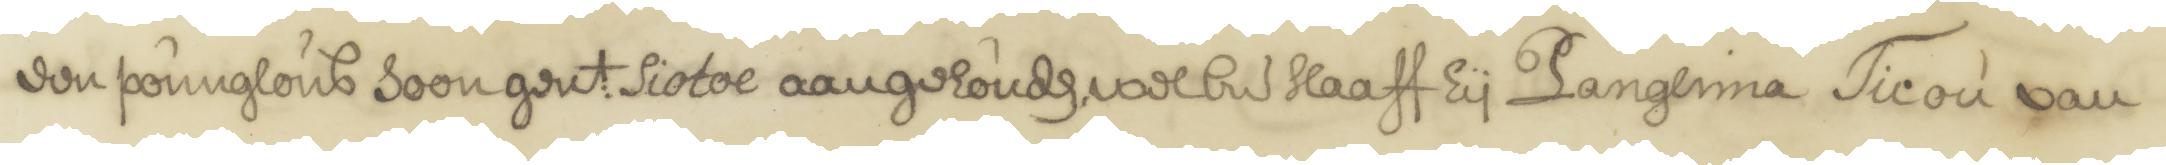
een pounglous soon gen:t siotoe aangehouden, welke slaaff hij Panglima Ticou van
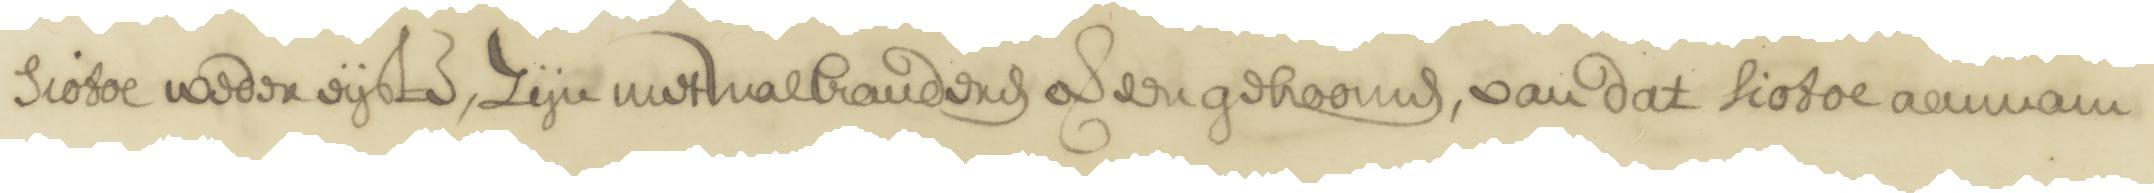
siotoe weder eijste, zijn met malkanderen overeen gekoomen, van dat siotoe aannam
